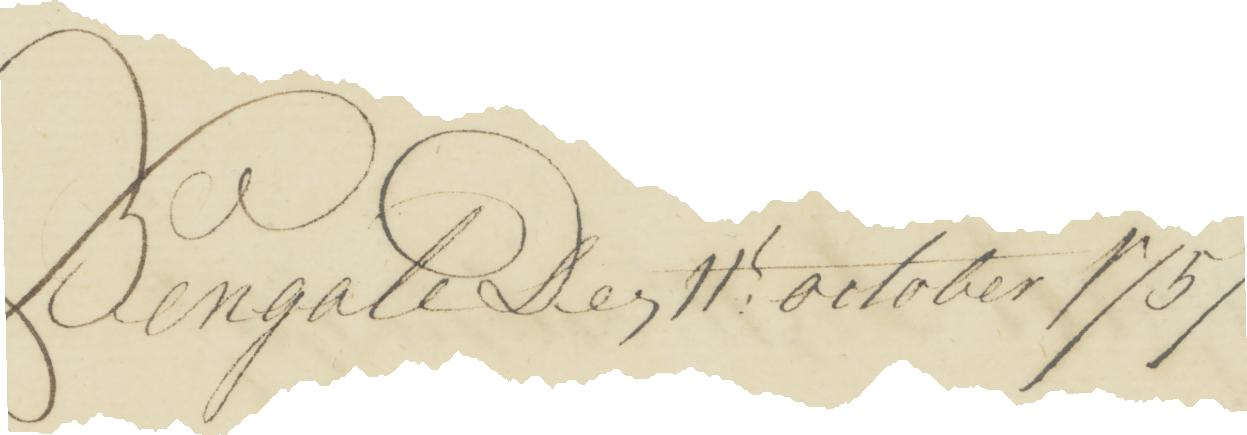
Bengale Den 11:' october 1757
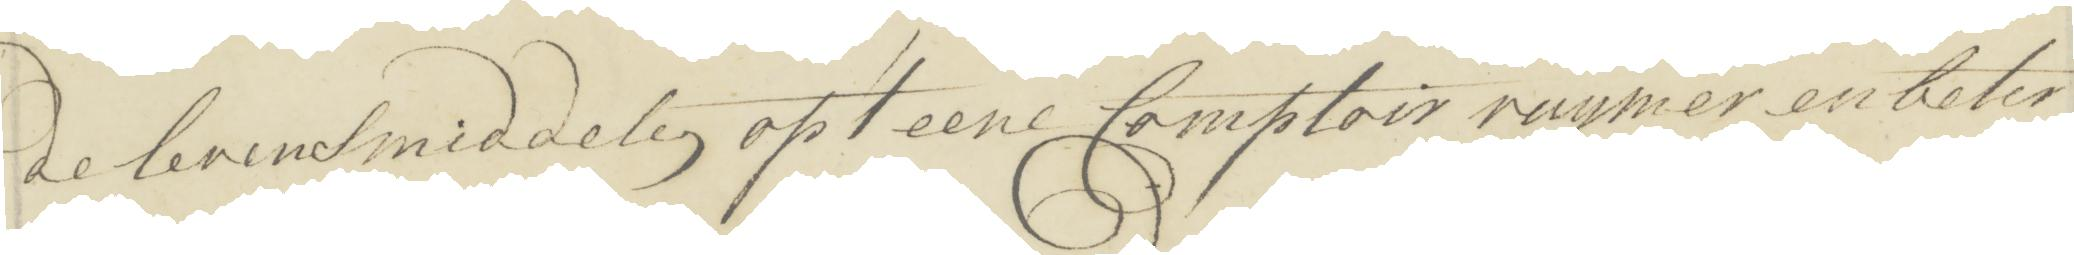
de levensmiddelen op ’t eene Comptoir ruymer en beter
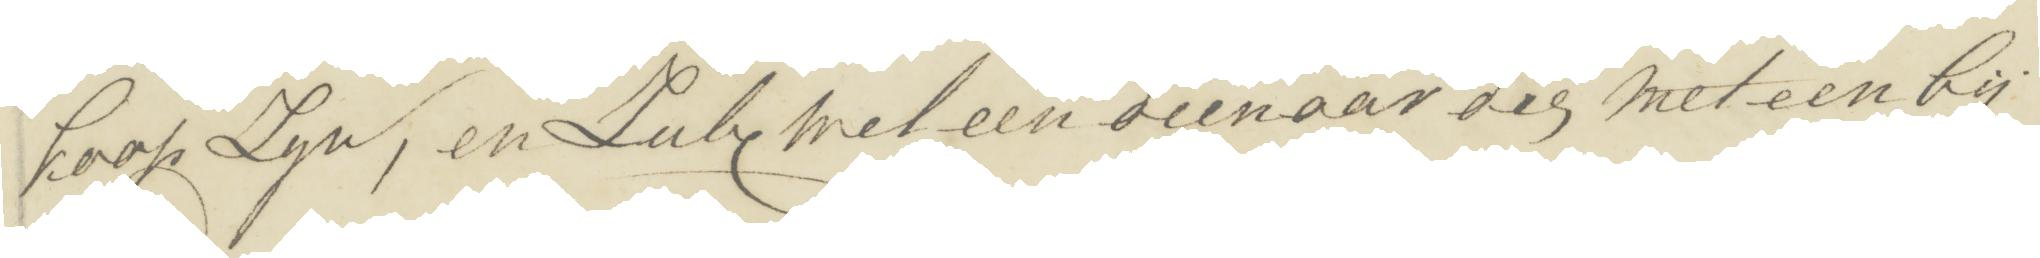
koop zyn, en zulx met een dienaar dien met een bij
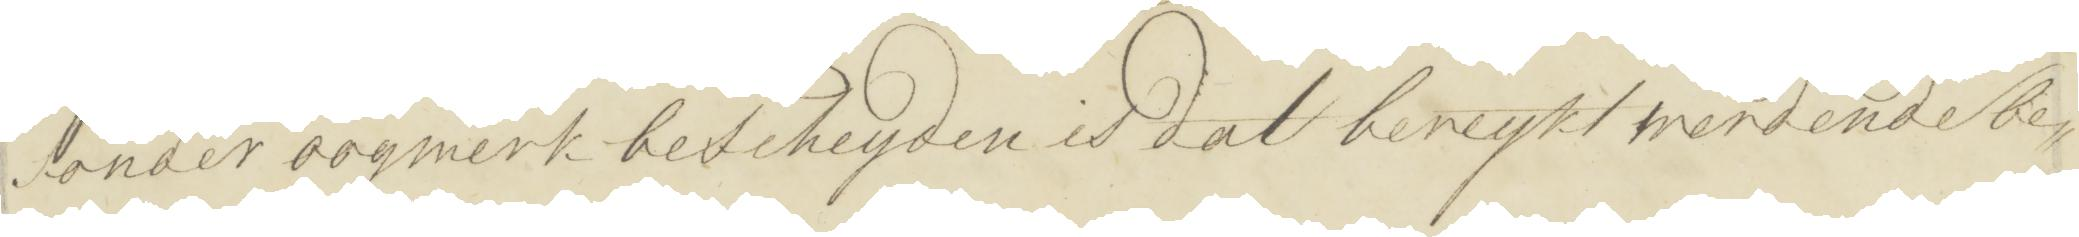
sonder oogmerk bescheyden is dat bereykt werdende be„
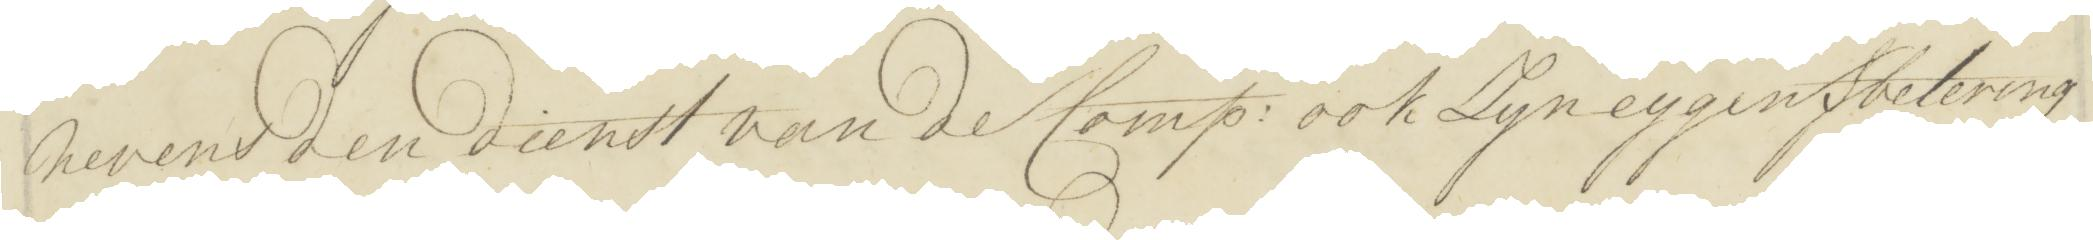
nevens den dienst van de Comp: ook zyn eygen verbetering
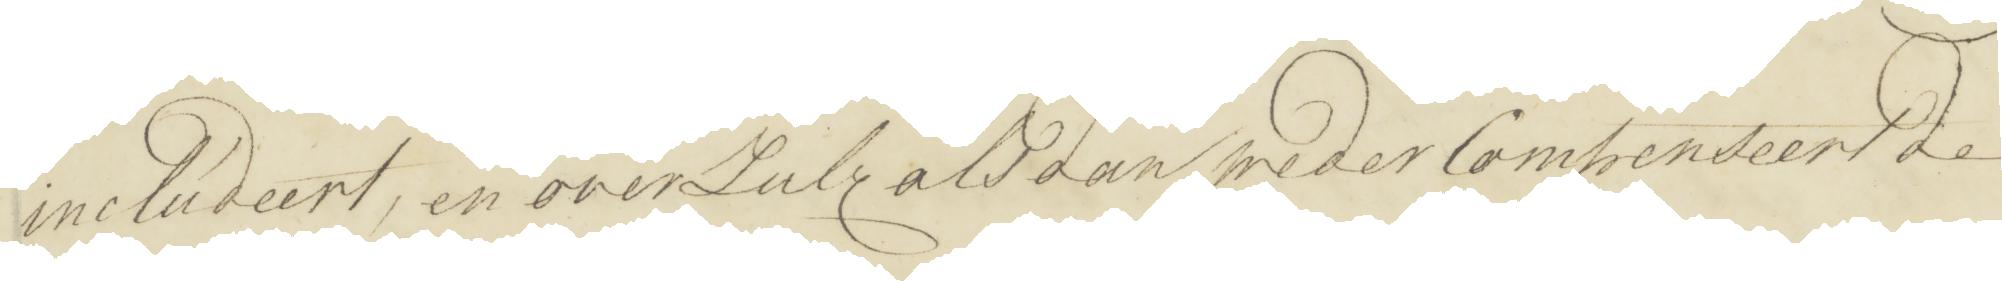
includeert, en over zulx als dan weder Compenseert de
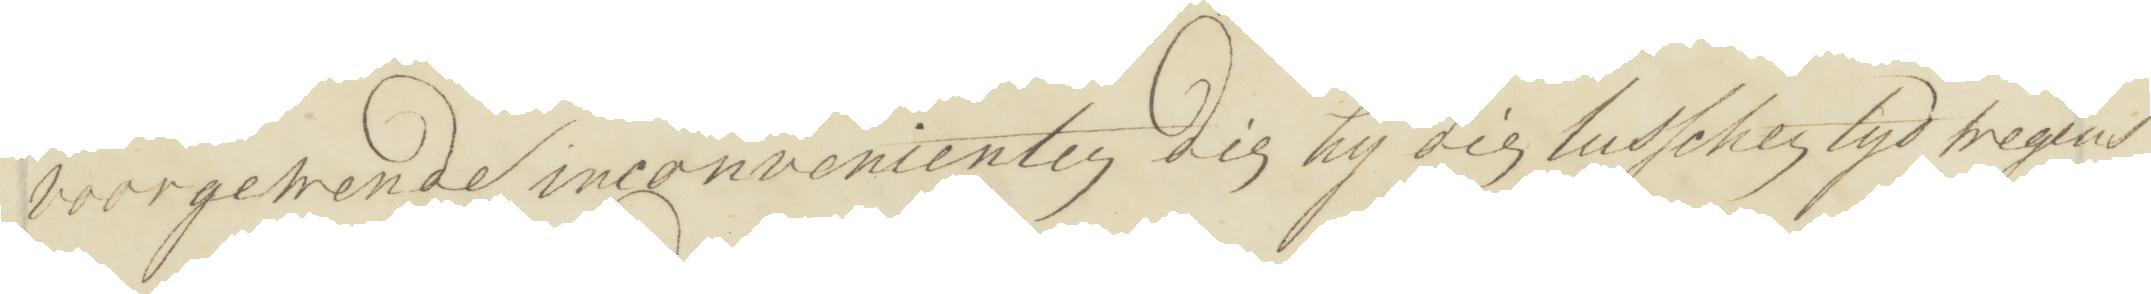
voorgewende inconvenienten dien hy dien tusschen tyd wegens
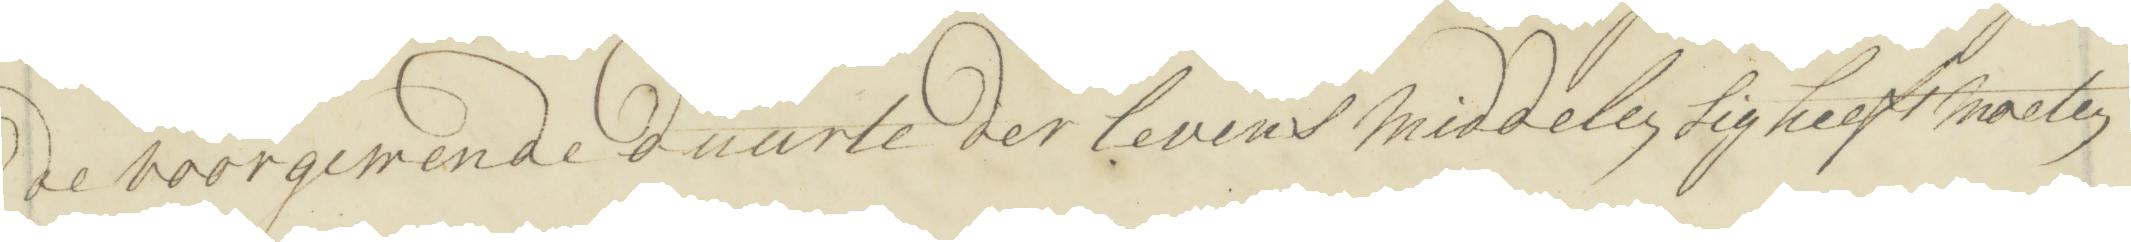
de voorgewende duurte der levensmiddelen sig heeft moeten
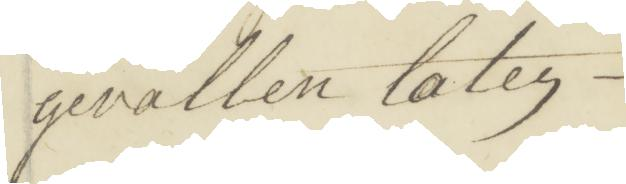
gevallen laten
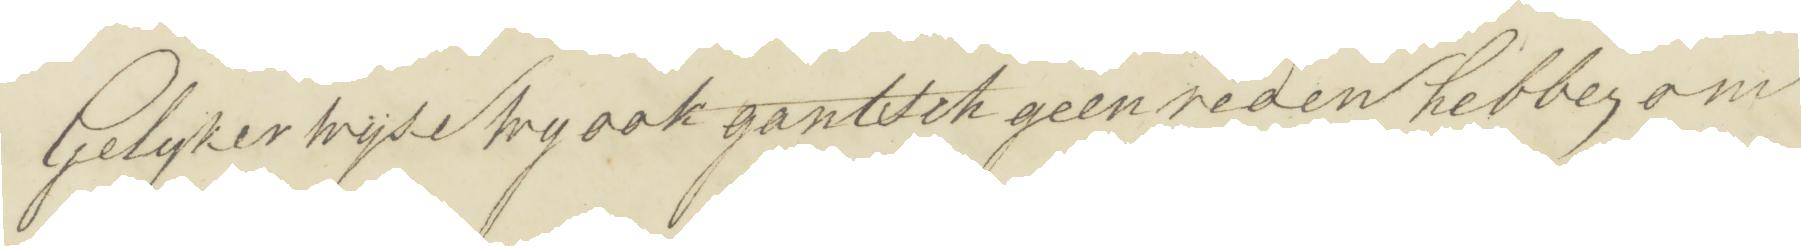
Gelyker wijse wy ook gantsch geen reden hebben om
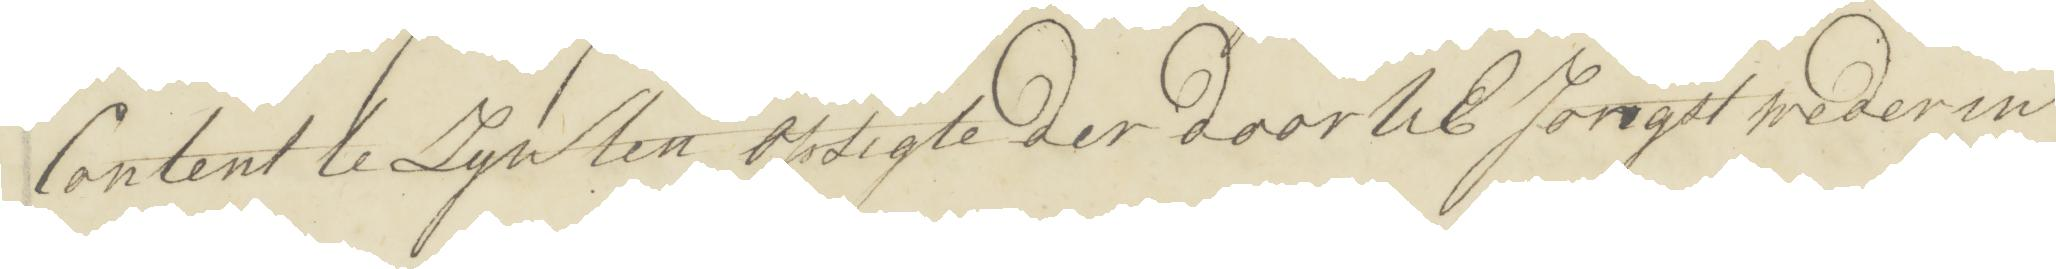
Content te zyn ten opsigte der door UE jongst weder in
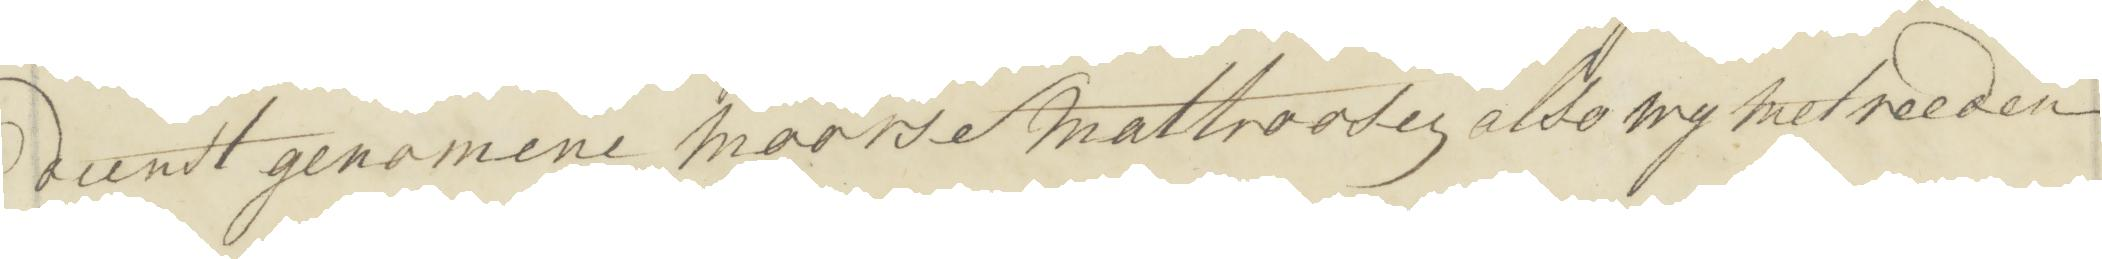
dienst genomene moorse mattroosen also wy met reeden
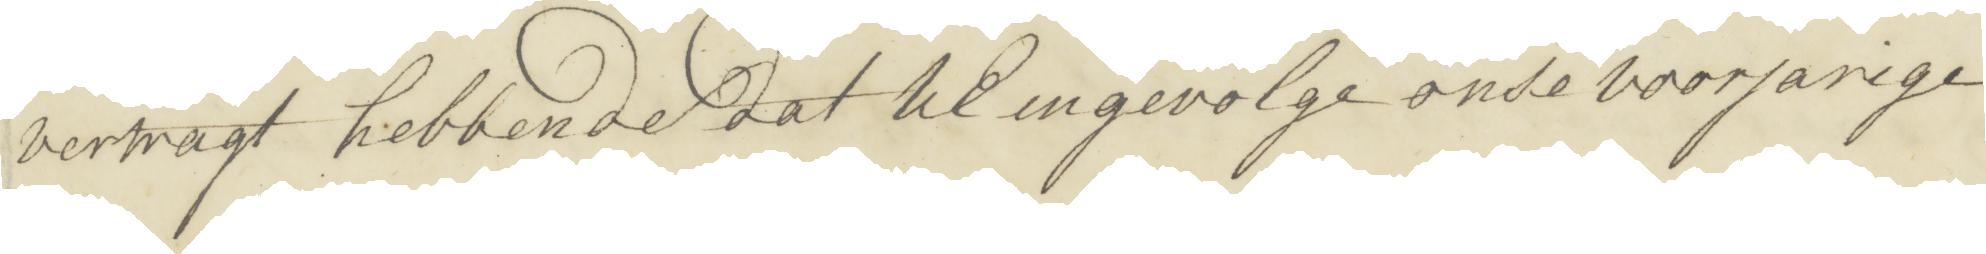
vertragt hebbende dat UE ingevolge onse voorjarige
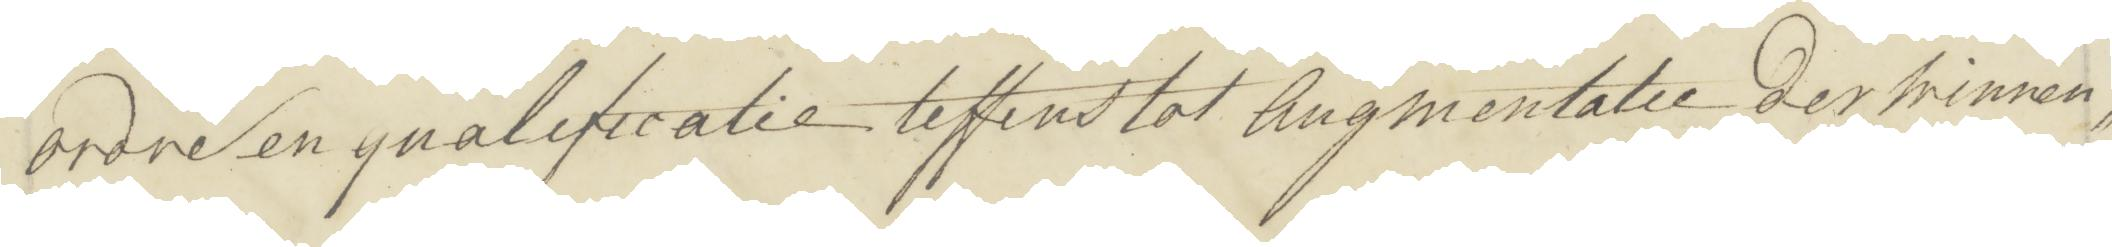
ordre en qualificatie teffens tot Augmentatie der winnen„
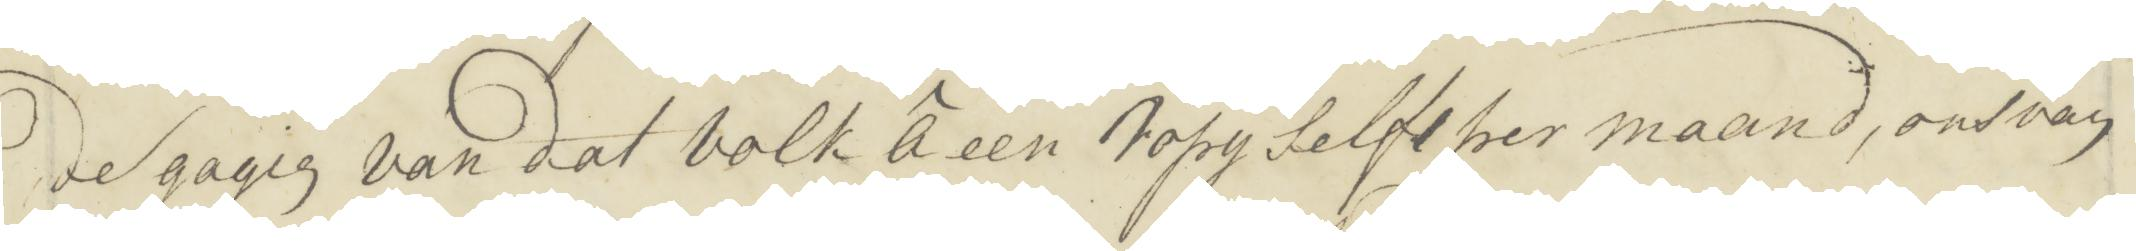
de gagien van dat volk â een vopy selfs per maand, ons van
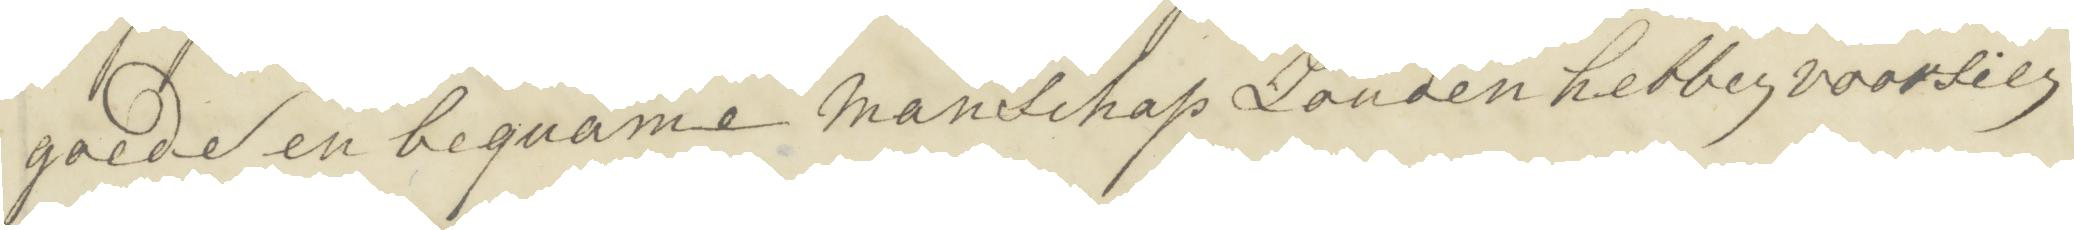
goede en bequame manschap zouden hebben voorsien
